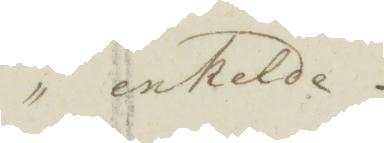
„ enkelde
